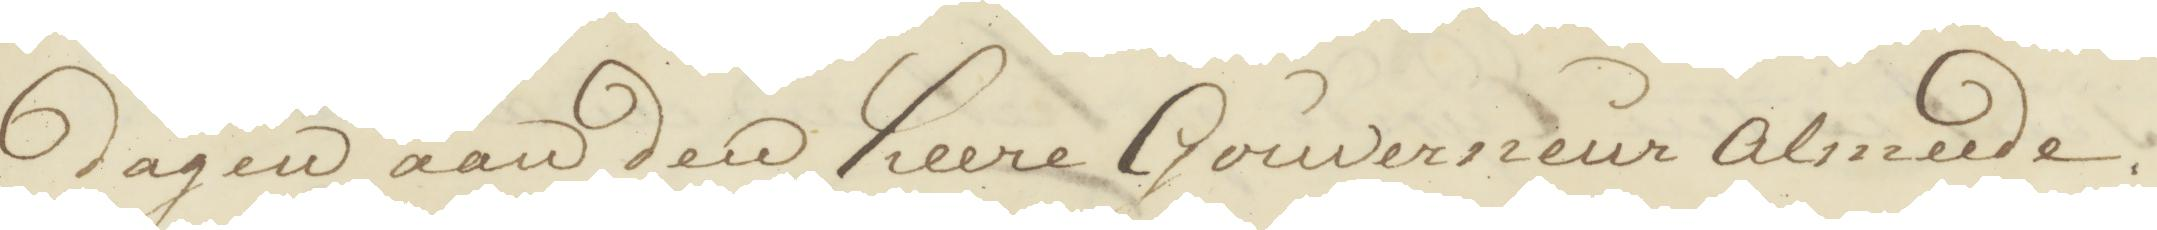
dagen aan den heere Gouverneur almeede
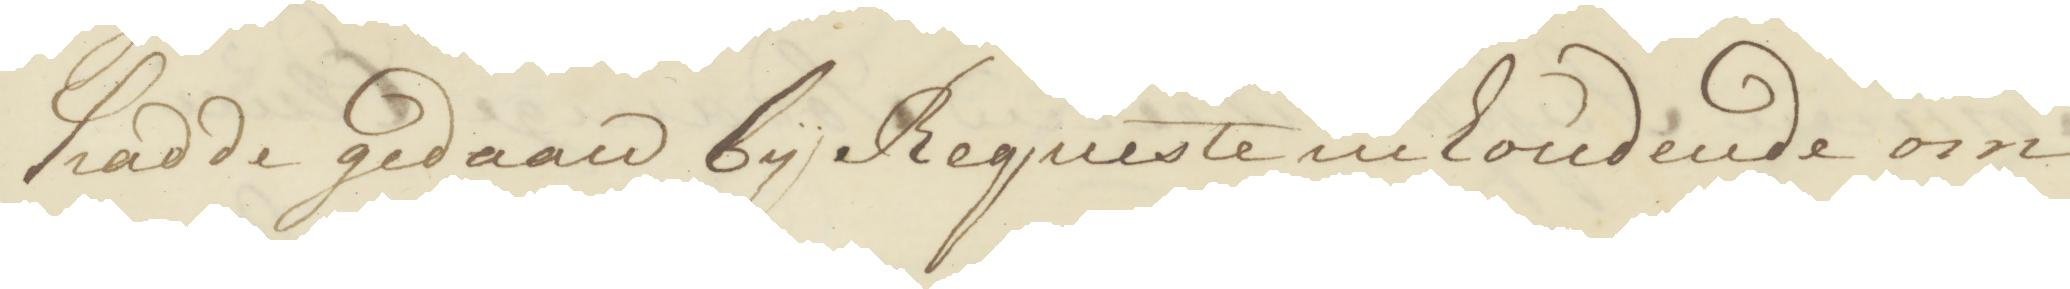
hadde gedaan bij Requeste inhoudende om
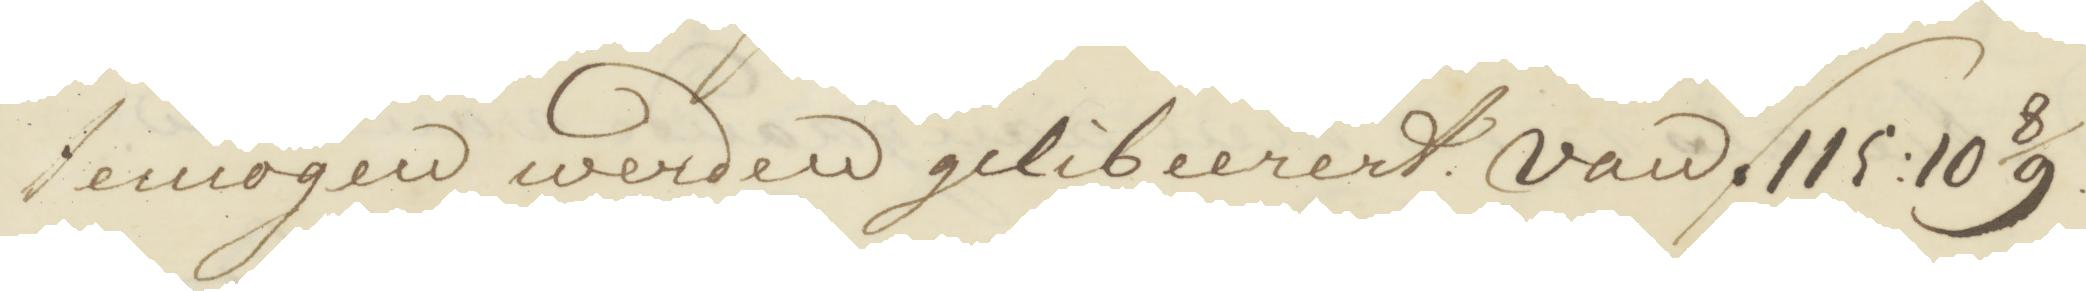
temogen werden gelibeerert: van ƒ115:10 8/9
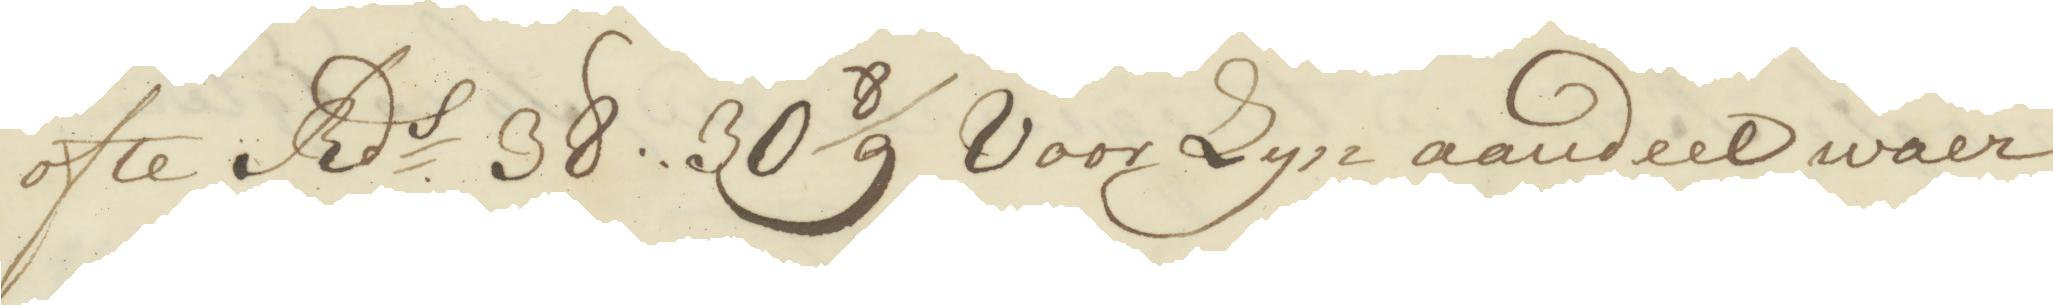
ofte Rd=s 38: 30 8/9 voor zyn aandeel waer
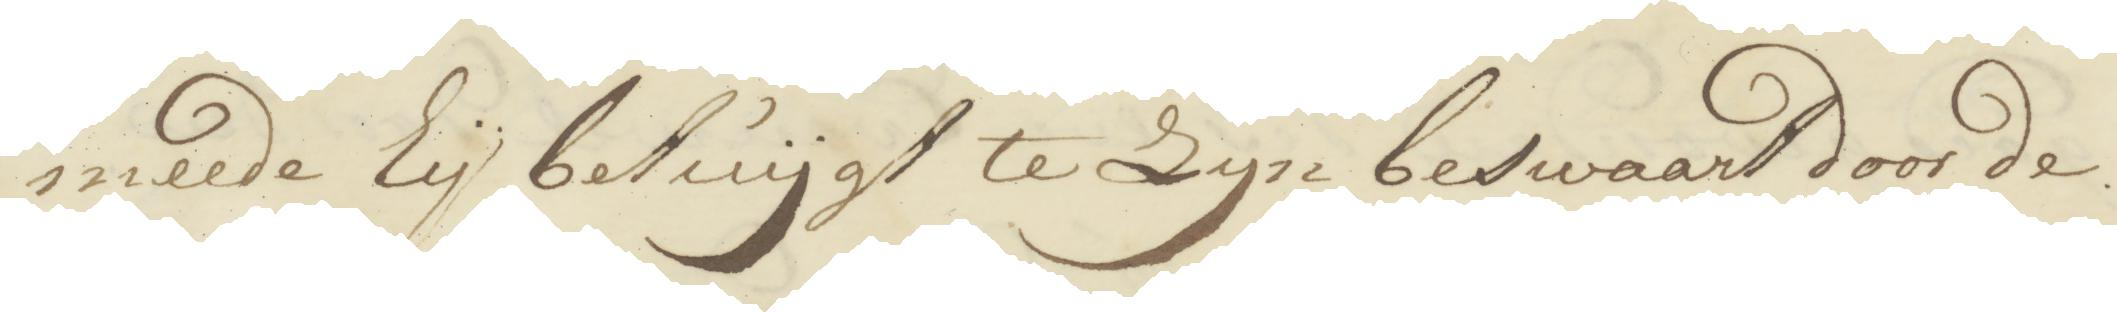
meede hij betuijgt te zyn beswaart door de
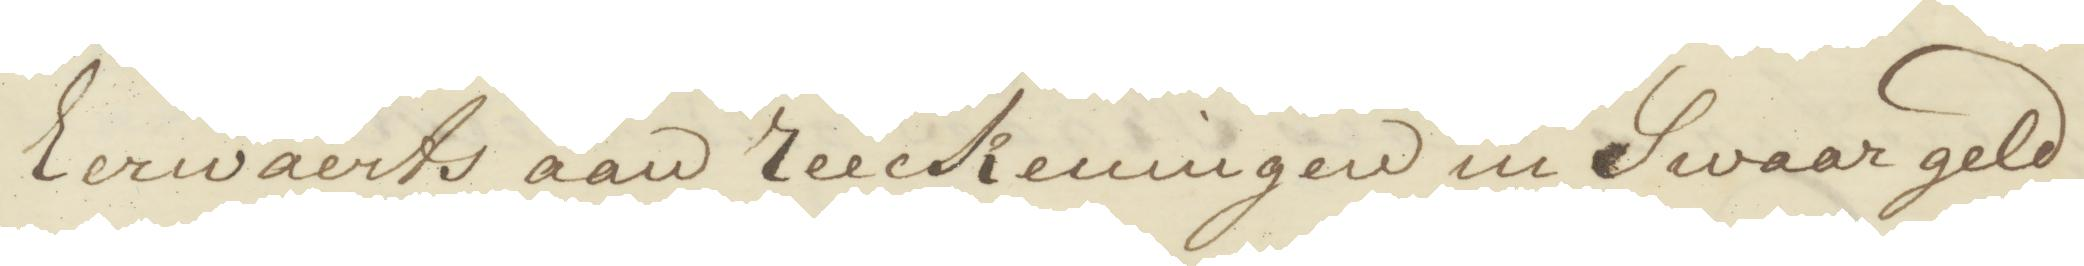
herwaerts aan reeckeningen in swaar geld
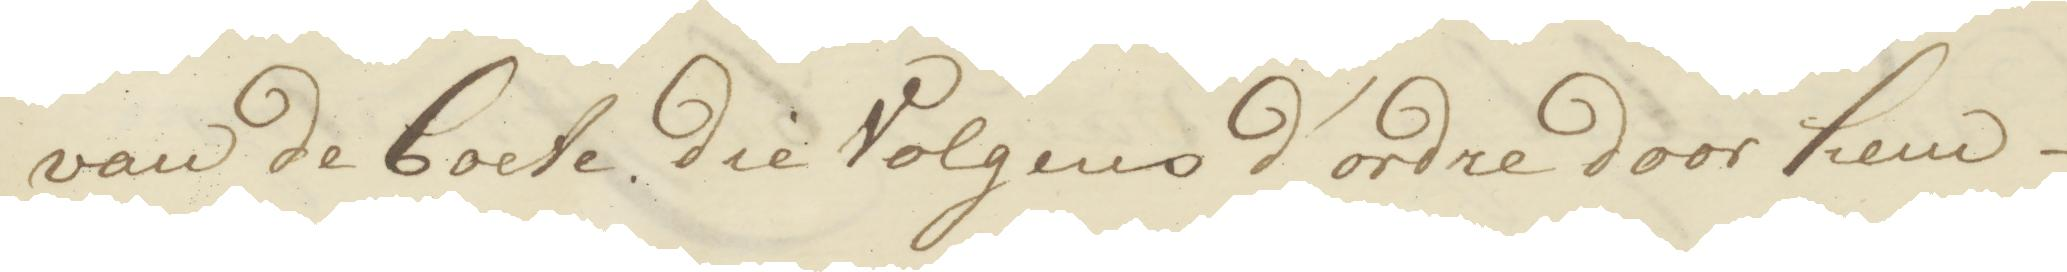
van de boete, die volgens d’ ordre door hem -
